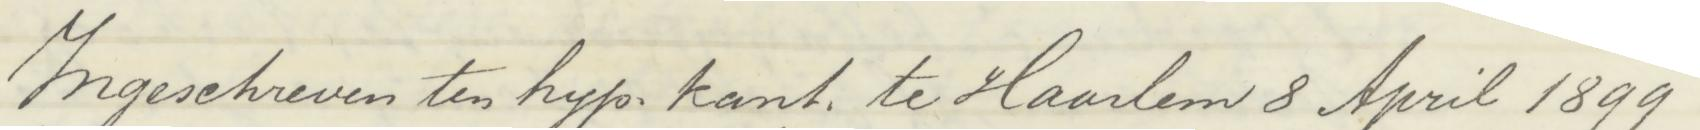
Ingeschreven ten hyp kant, te Haarlem 8 April 1899
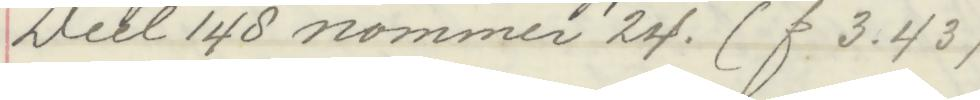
Deel 148 nommer 24. ( ƒ 3.43 )
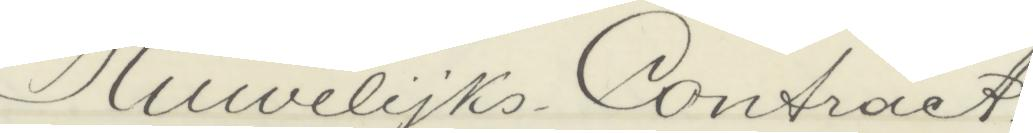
Huwelijks-Contract.
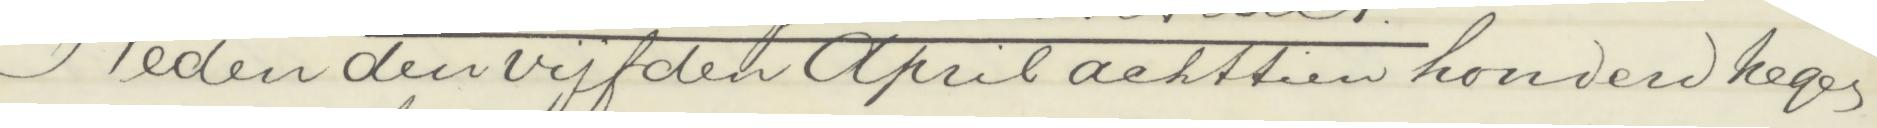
Heden den vijfden April achttien honderd negen
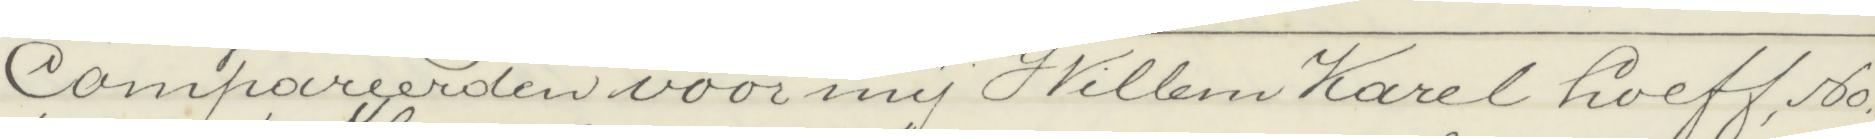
Compareerden voor mij Willem Karel Loeff, No„
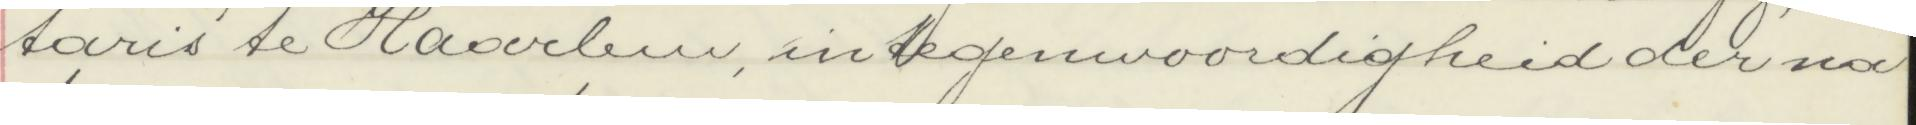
taris te Haarlem, in tegenwoordigheid der na
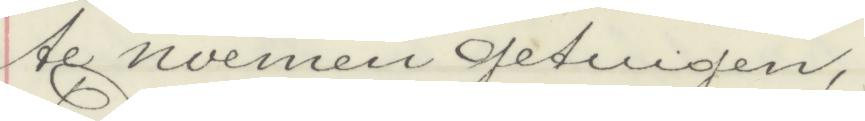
te noemen getuigen,
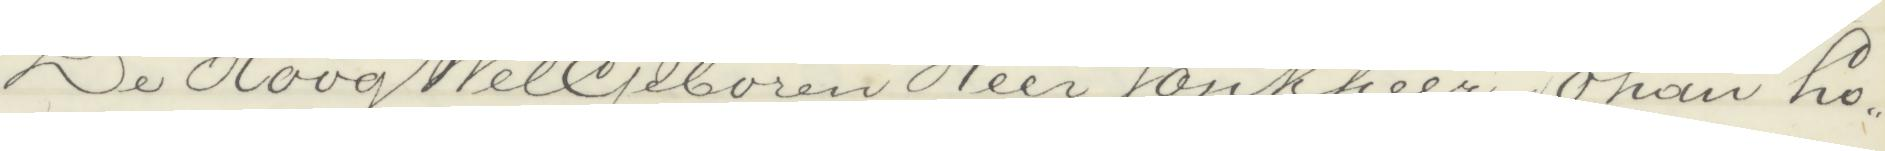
De Hoog Wel Geboren Heer Jonkheer Johan Lo„
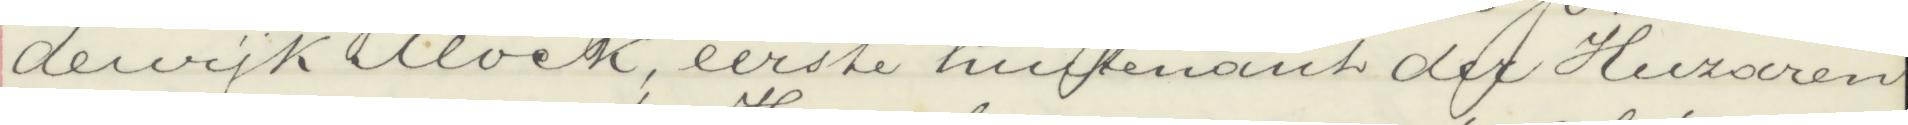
dewijk Mock, eerste Luitenant der Huzaren
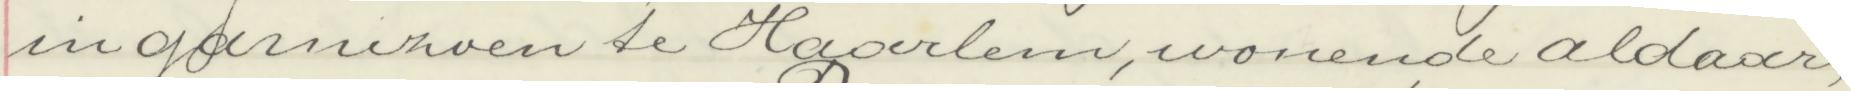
in garnizoen te Haarlem, wonende aldaar,
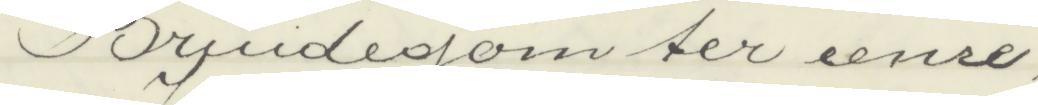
Bruidegom ter eenre,
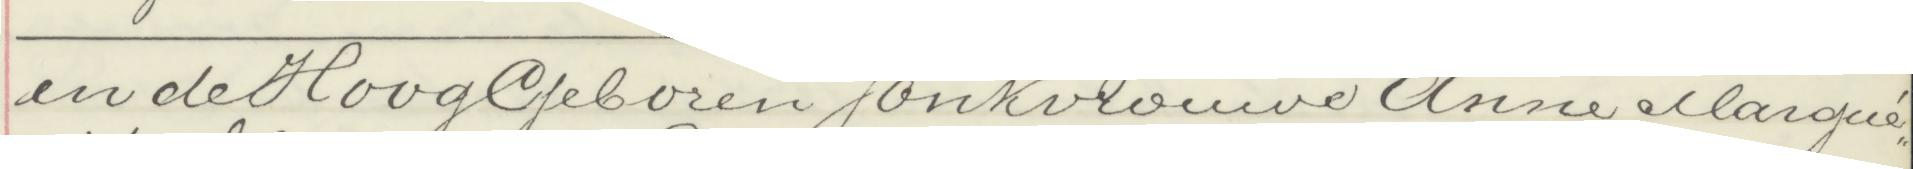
en de Hoog Geboren Jonkvrouwe Anne Margué„
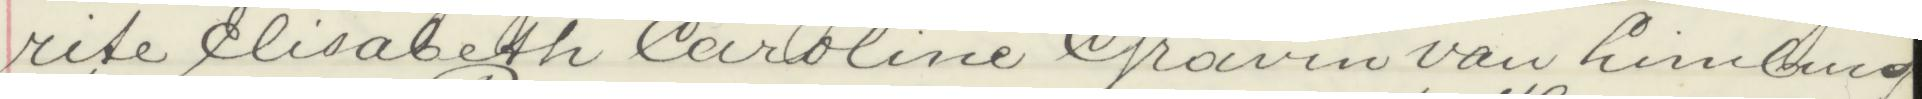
rite Elisabeth Caroline Gravin van Limburg
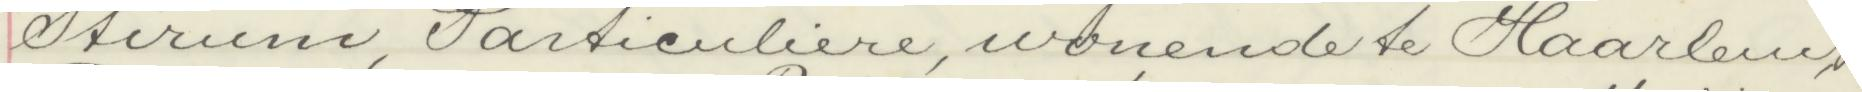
Stirum, Particuliere, wonende te Haarlem,
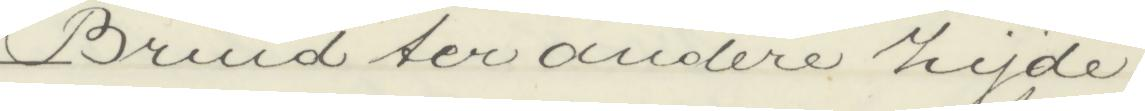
Bruid ter andere zyde,
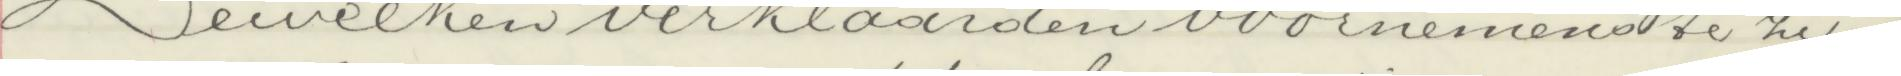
Dewelken verklaarden voornemens te zijn
